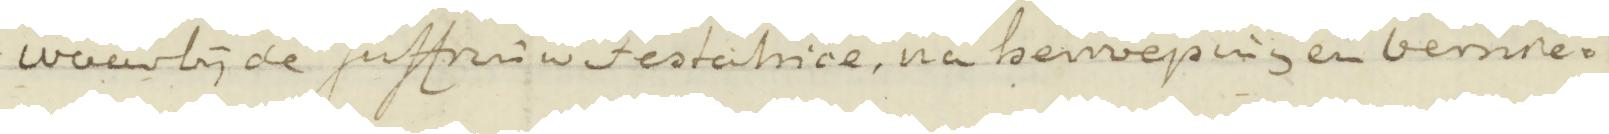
waarbij de Juffrouw Testatrice, na herroeping en vernie=
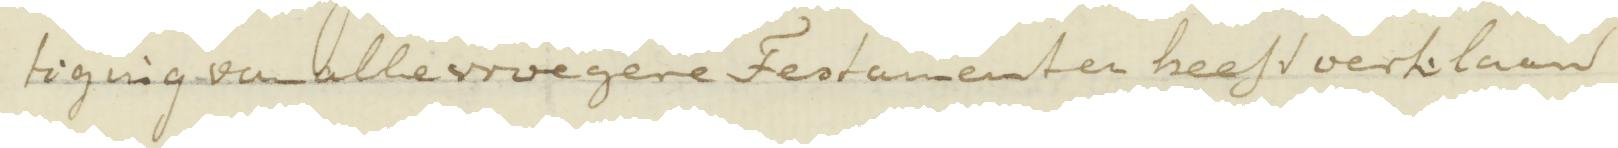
tiging van alle vroegere Testamenten heeft verklaard
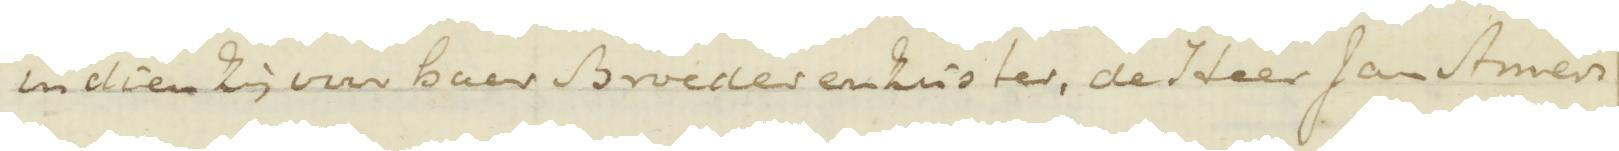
indien zij van haar Broeder en zuster, de Heer Jan Amers
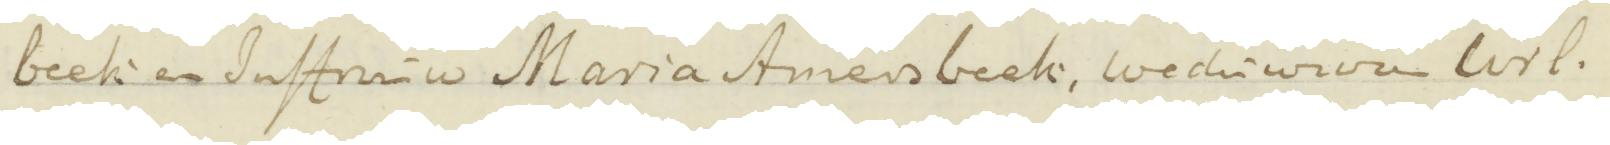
beek en Juffrouw Maria Amersbeek, weduwe van Wil=
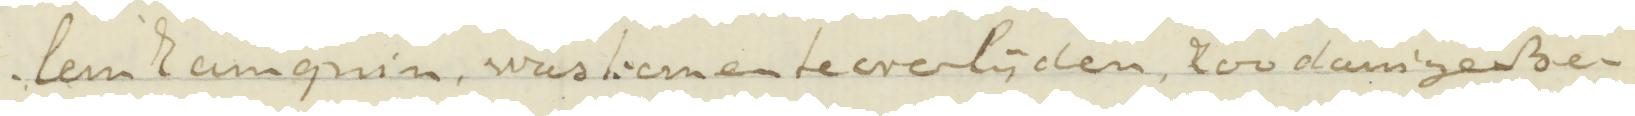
-lem Ramquin, was komen te overlijden, zoo danige Be-
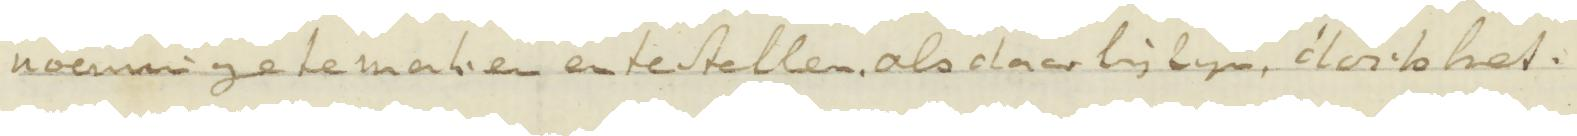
noeminge te maken en te stellen, als daar bij zijn, doch het-
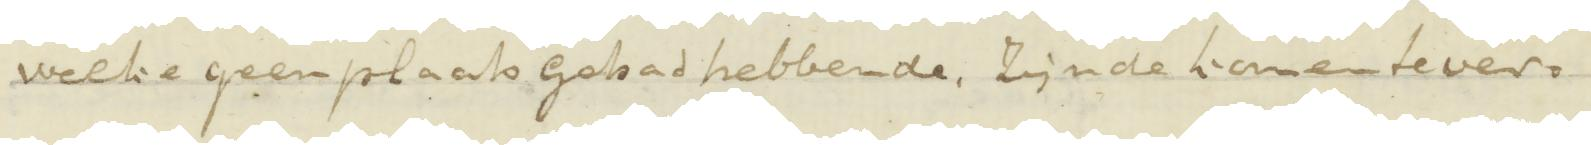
welke geen plaats gehad hebbende, zijnde komen te ver=
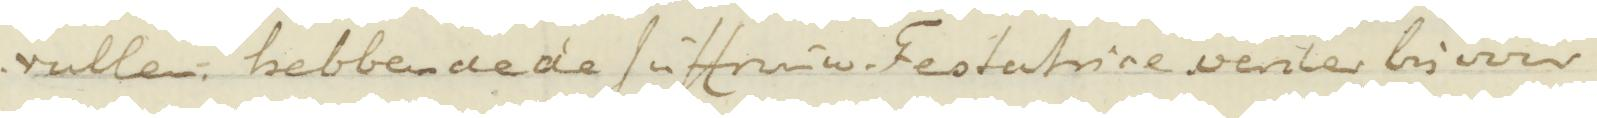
vallen; hebbende de Juffrouw Testatrice verites bij voor
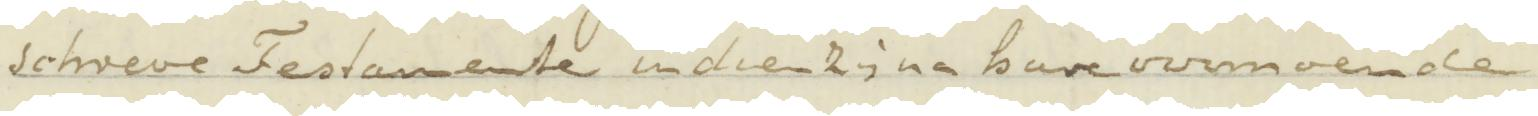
schreve Testamente indien zij na hare voornoemde
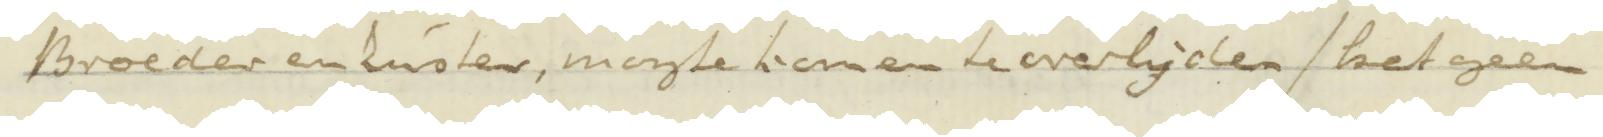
Broeder en zuster, mogte komen te overlijden / het geen
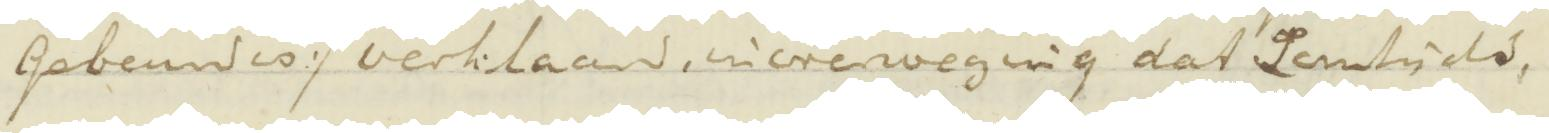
Gebeurd is :/ verklaard, in overweging dat zomtijds,
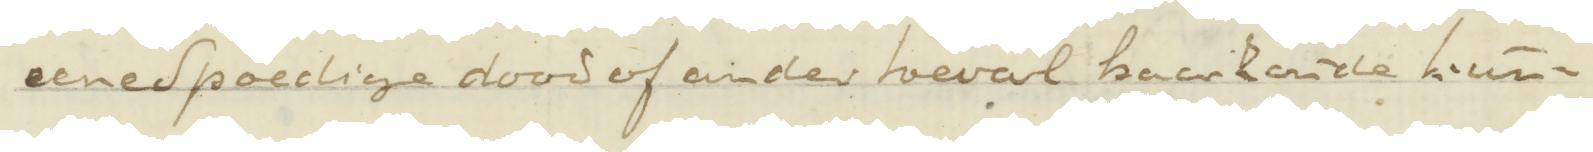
eene spoedige dood of ander toeval haar zoude kun=
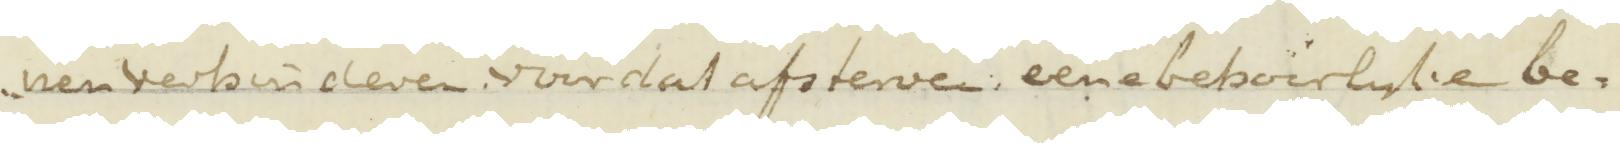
=nen verhinderen voordat afsterven eene behoorlyke be=
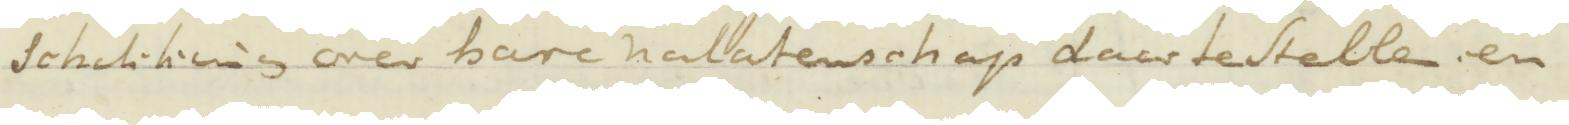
schikking over hare nalatenschap daar te stellen, en
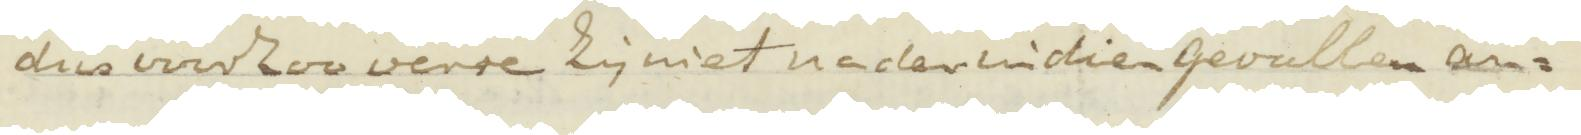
dus voor zoo verre zij niet nader indien gevallen an=
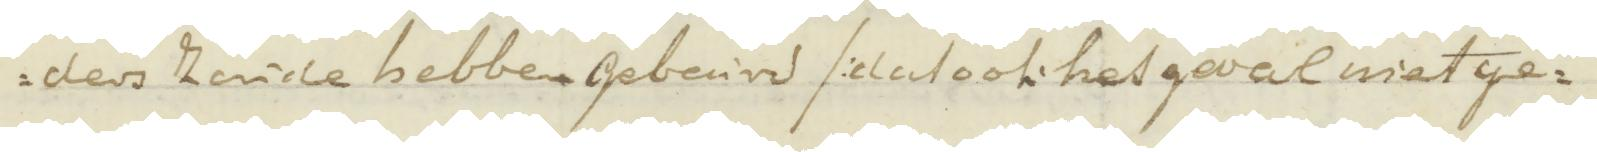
=ders zoude hebben gebeurd /:dat ook het geval niet ge=
